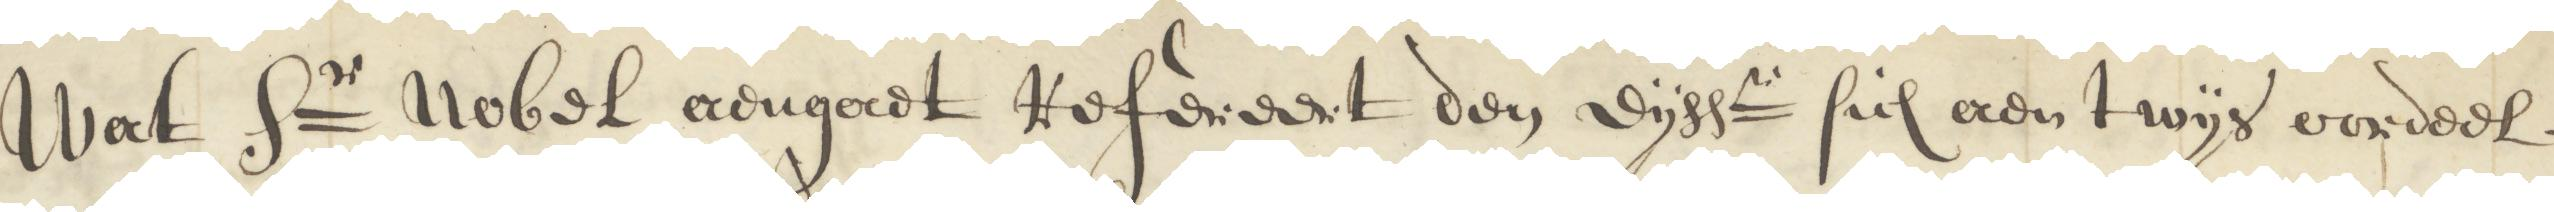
Wat S=r Nobel aengaet Refereert den Eijss=r sich aen 't wijs oordeel
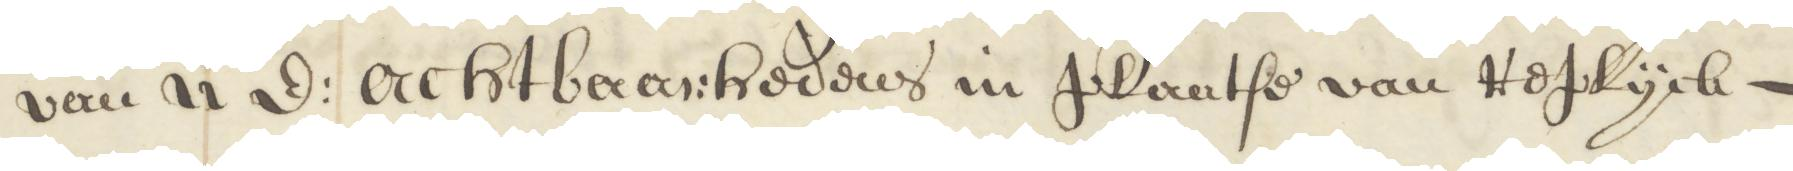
van u E: achtbaarhedens in plaatse van Replijck -
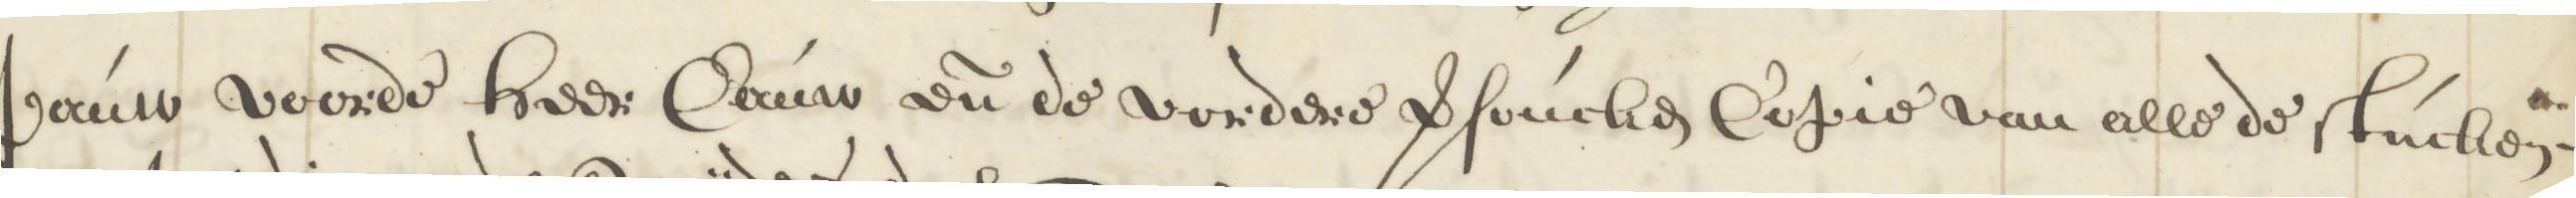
Pauw voorde heer Cauw en de vordere versoucken Copie van alle de stucken -
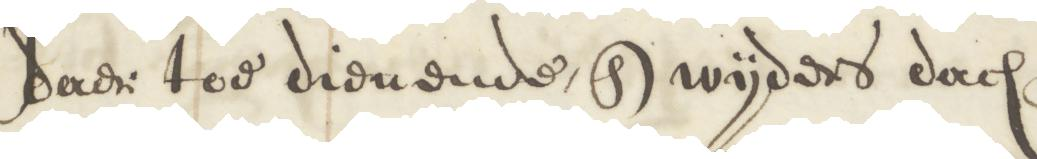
daer toe dienende, & wijders dach
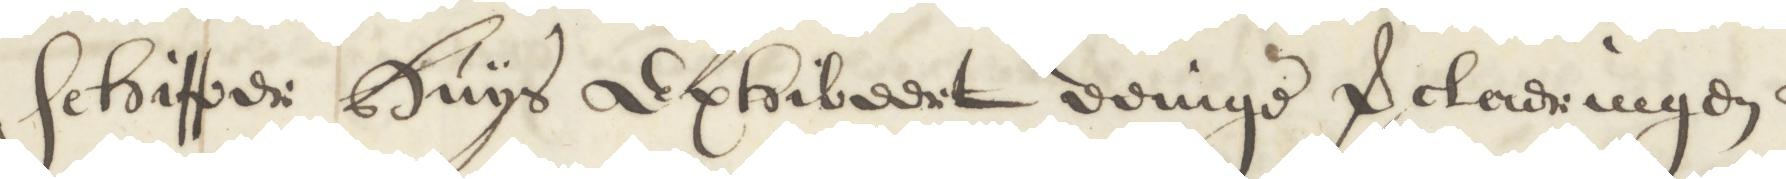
schipper Huijs Exhibeert eenige verclaeringen
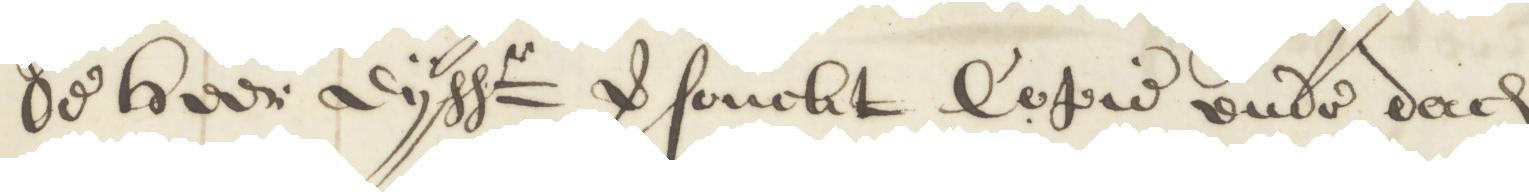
de heer Eijss=r versouckt Copie ende dach
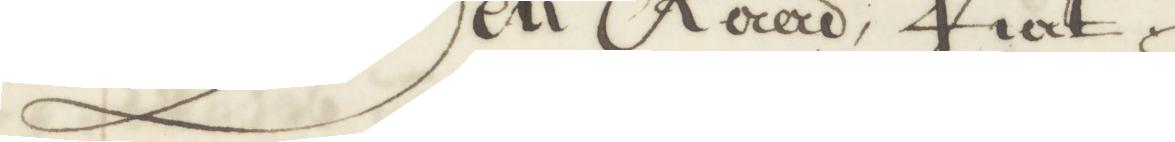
Den Raad, fiat.
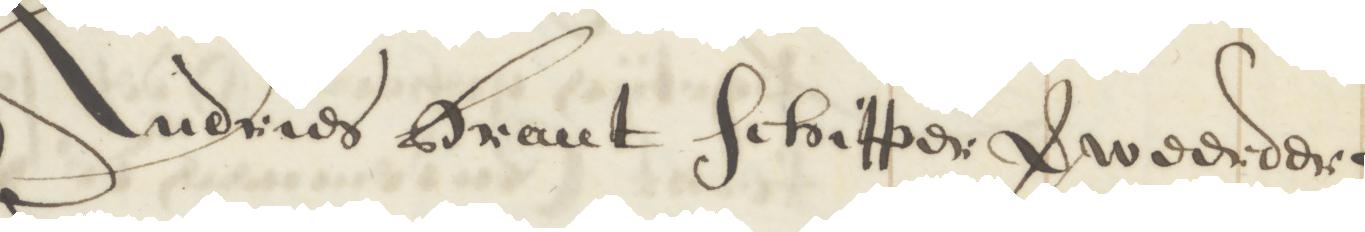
Andries brant Schipper verweerder.
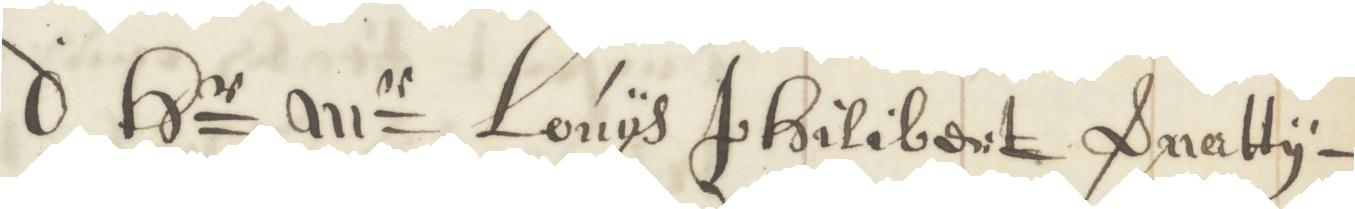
d’ H=r m=r Louijs philibert Vernattij
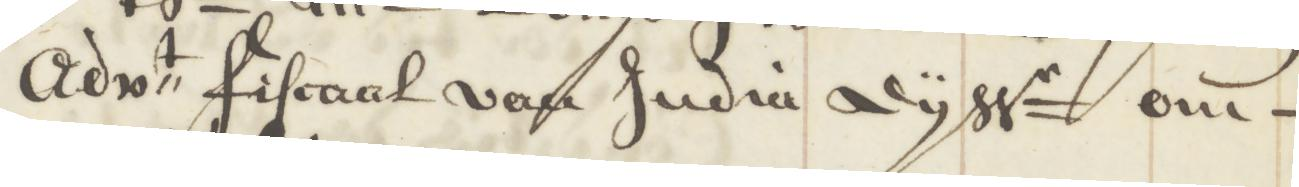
Adv„t fiscaal van Jndia Eijss=r om
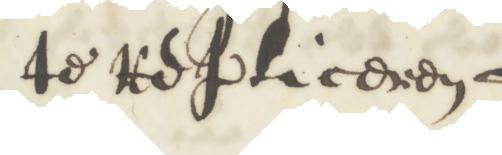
te Repliceren
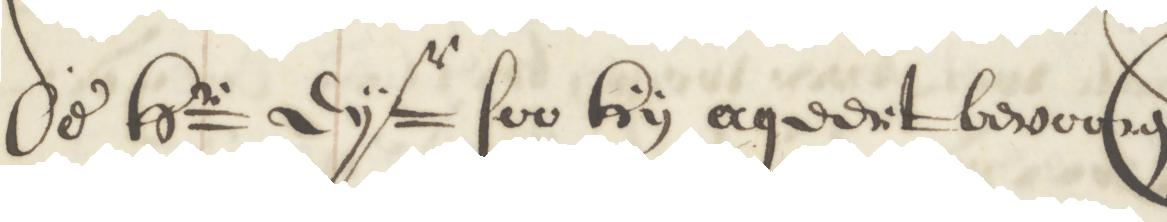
de H=r Eij=r soo hij ageert bevooren
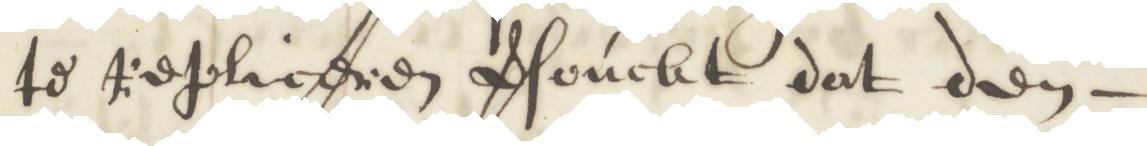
te t'epliceren versouckt dat den
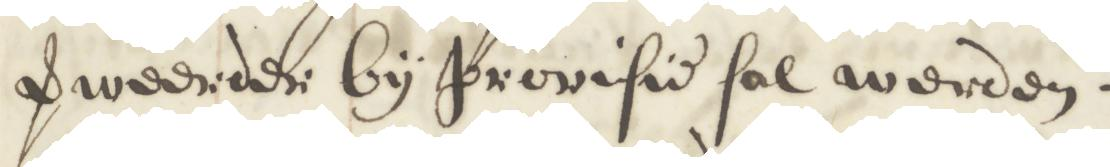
verweerder bij provisie sal werden
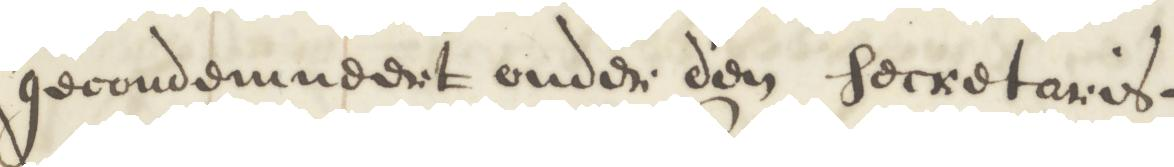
gecondemneert onder den secretaris
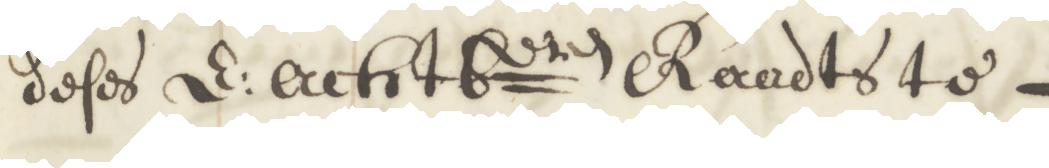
deses E: achtb=eren Raadts te
